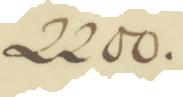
2200.
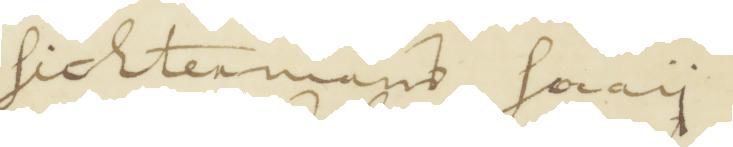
sichtermans saaij
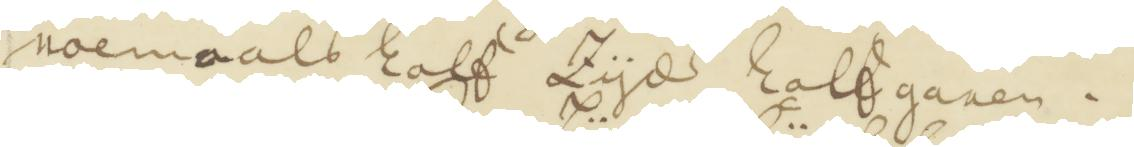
roemaals half Zijde halfgaren
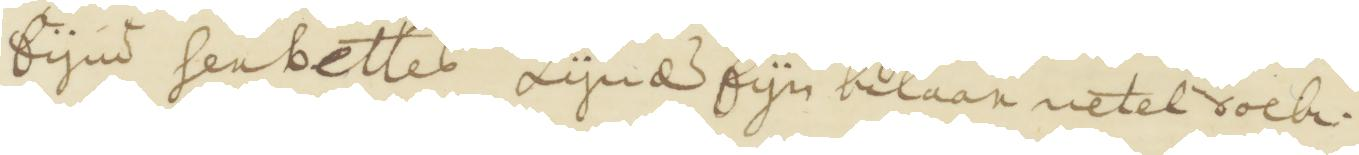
fijne serbettes zijnde fijn klaar netel doek
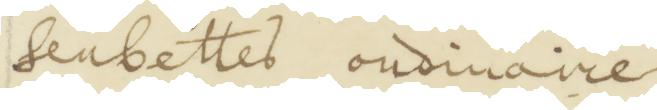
serbettes ordinaire
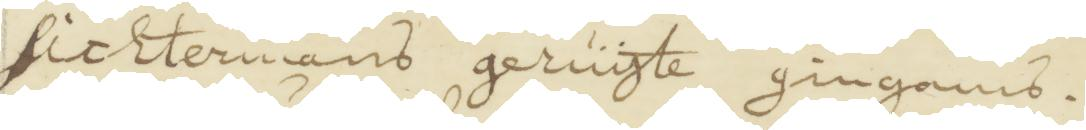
sichtermans geruijte gingams
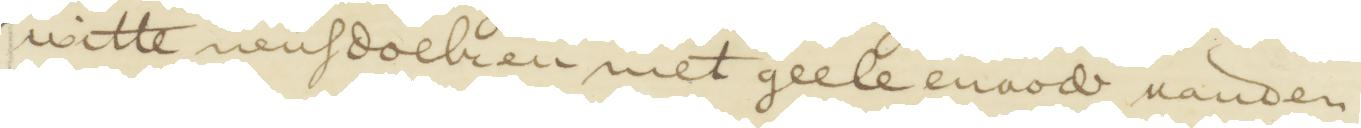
witte neusdolken met geele en oode randen
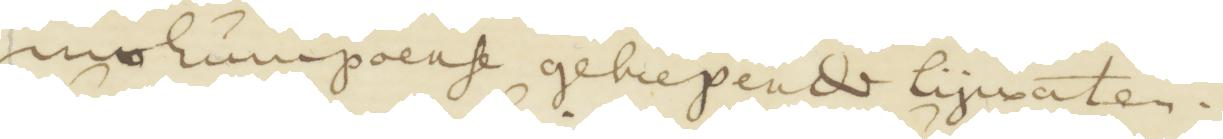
mohumpoerse gekeperde lijwaten
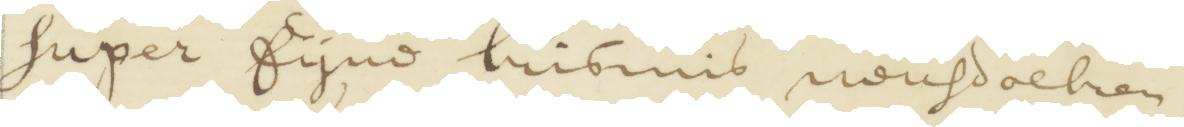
super fijne kismis neusdoeken
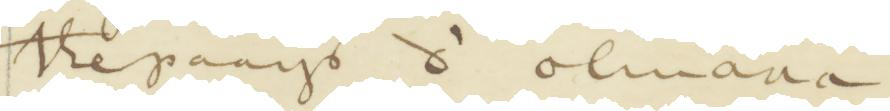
thepaaijs d' olmara
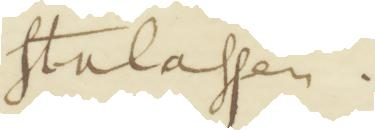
strlassen
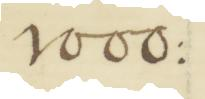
1000:
